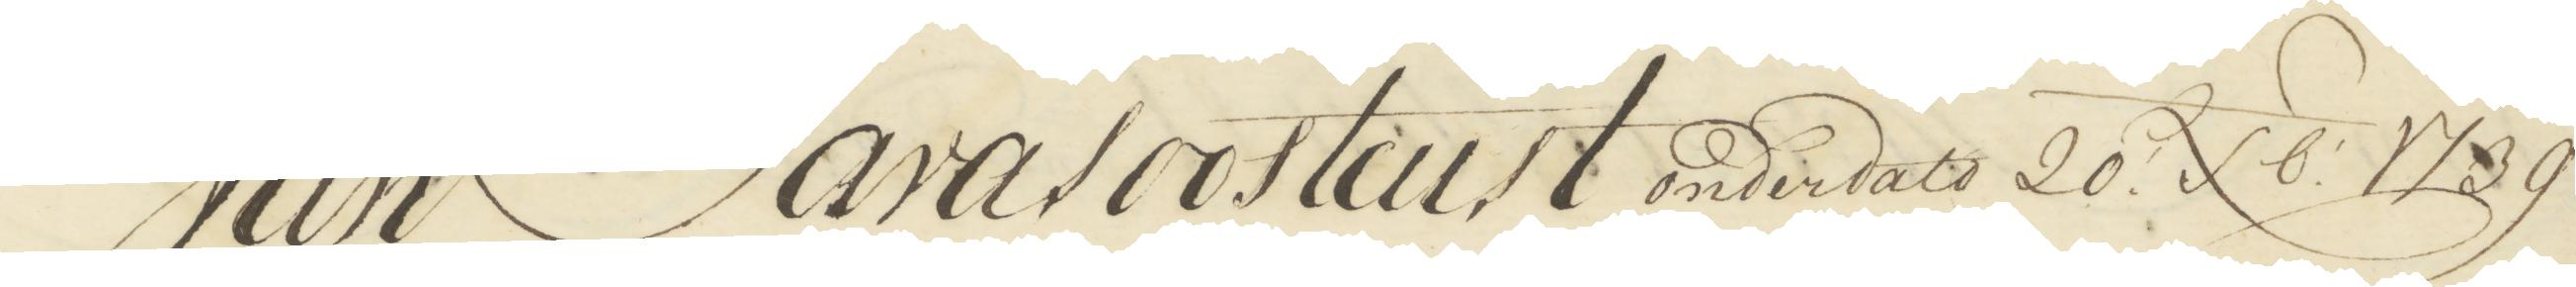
Van Javas oostcust onder dato 20:' Xb:' 1739
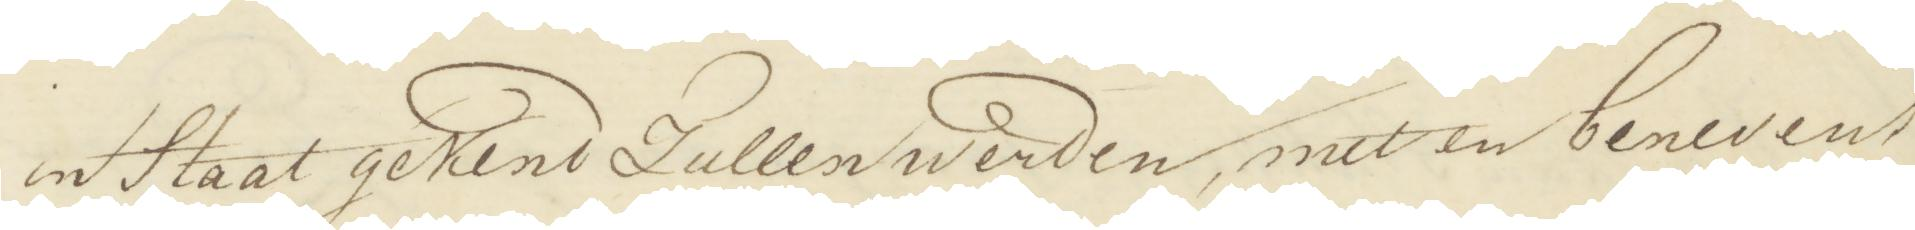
in staat gekend zullen werden, met en benevens
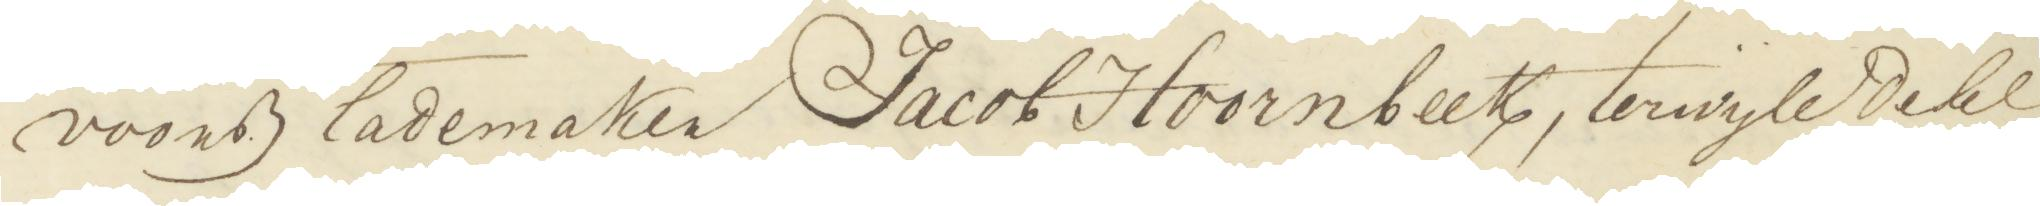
voorsz. lademaker Jacob Hoornbeek, terwijle desel
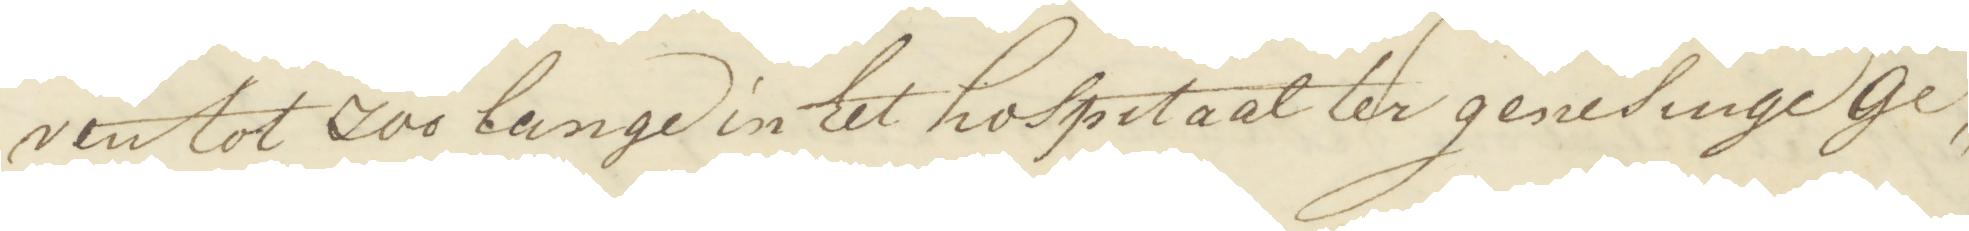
ven tot zoo lange in het hospitaal ter genesinge ge
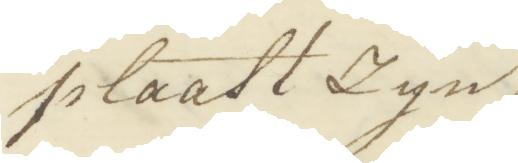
plaast zijn
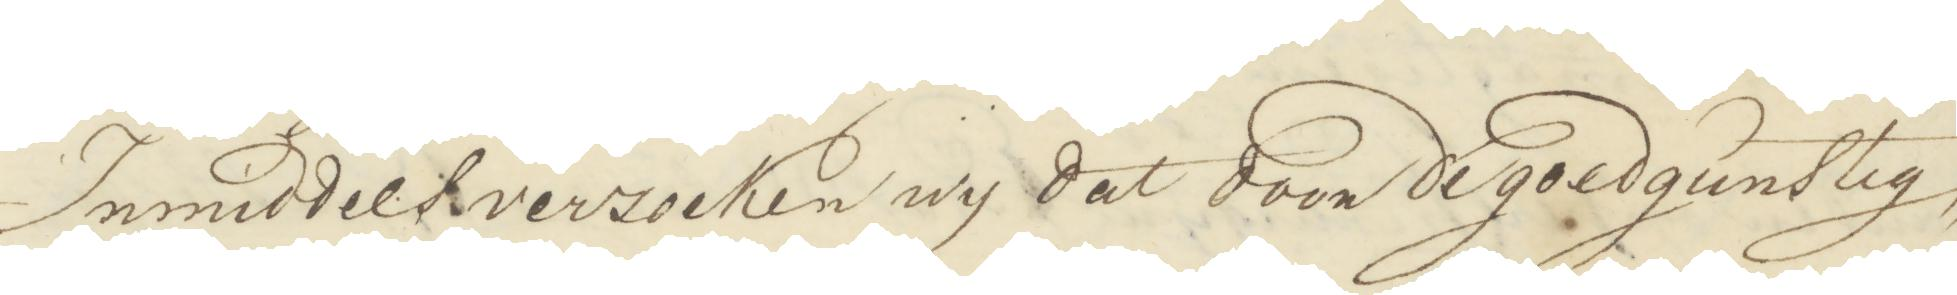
Jnmiddels verzoeken wij dat door de goedgunstig
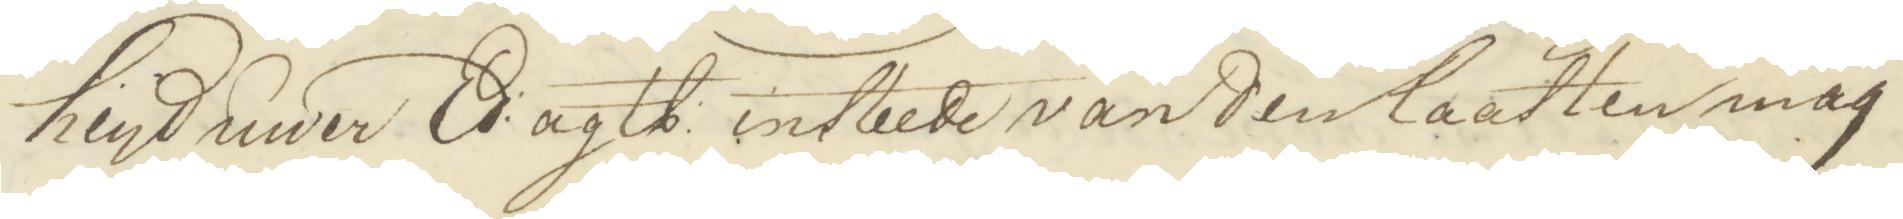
heijd uwer Ed: agtb: insteede van den laasten mag
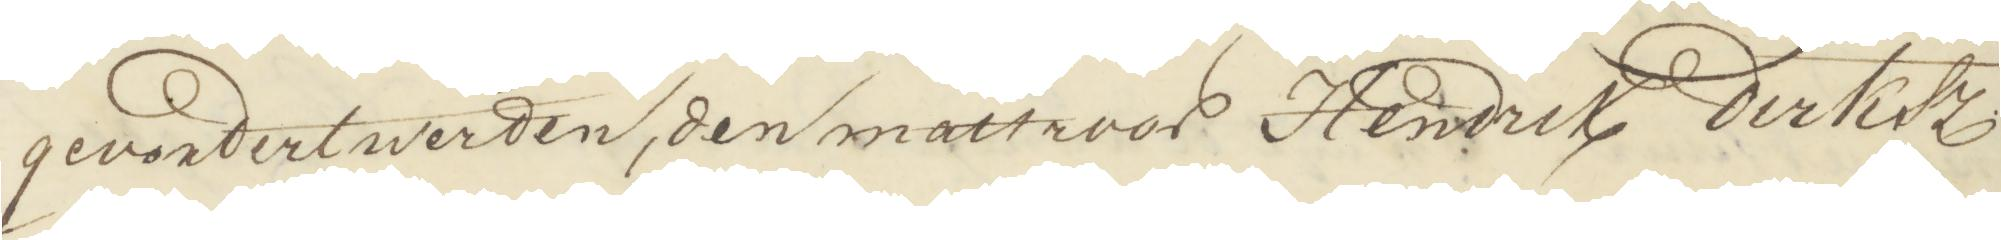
gevordert werden, den mattroos Hendrik dirksz
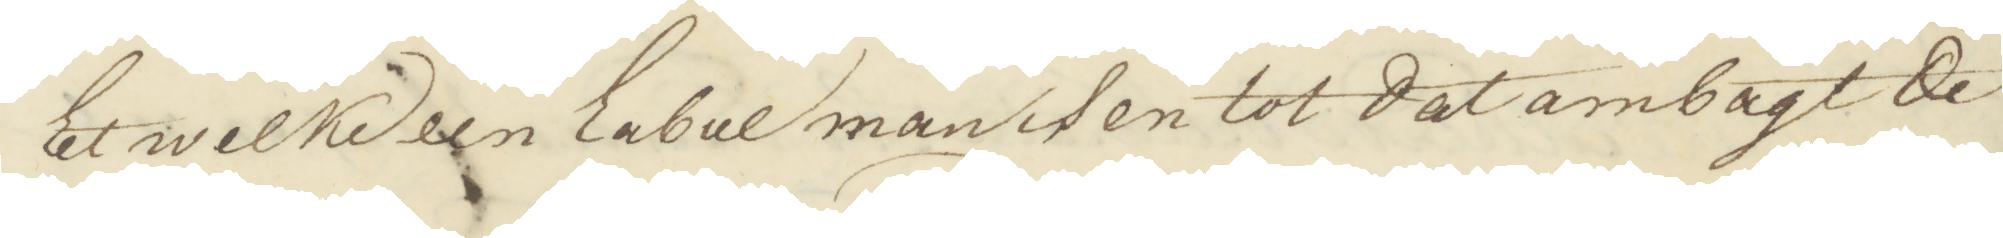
het welke een habul man is en tot dat ambagt de
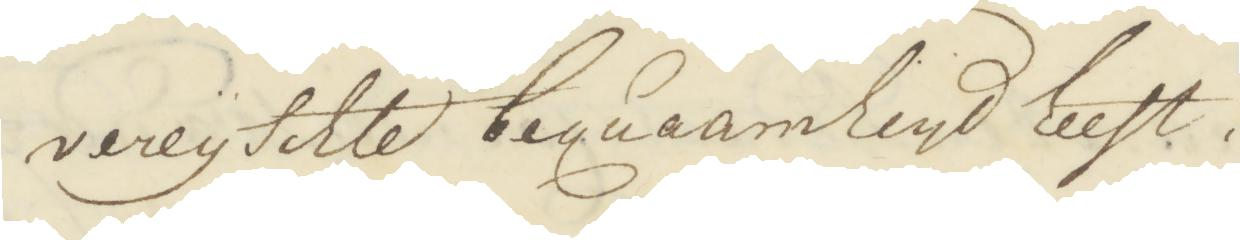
vereijschte bequaamheijd heeft
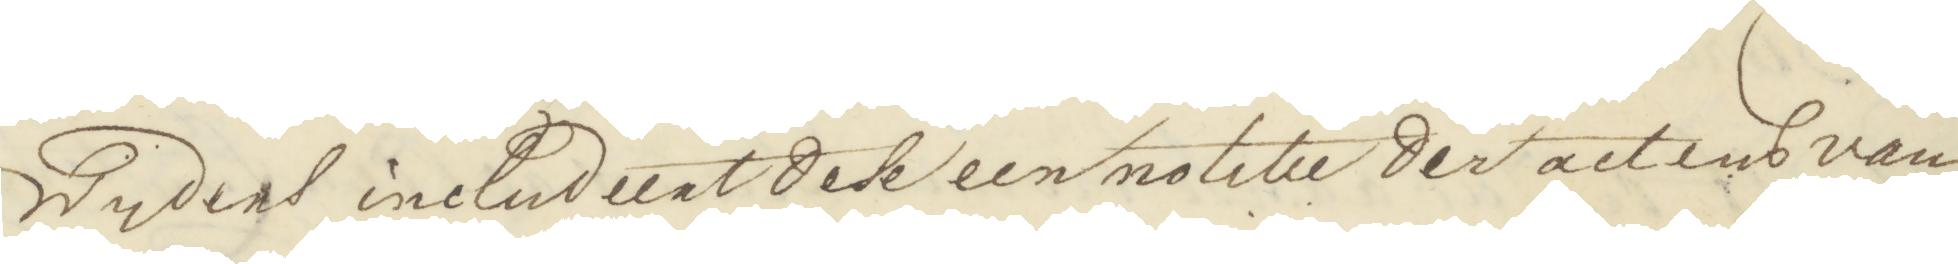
Wijders includeert dese een notitie der actens van
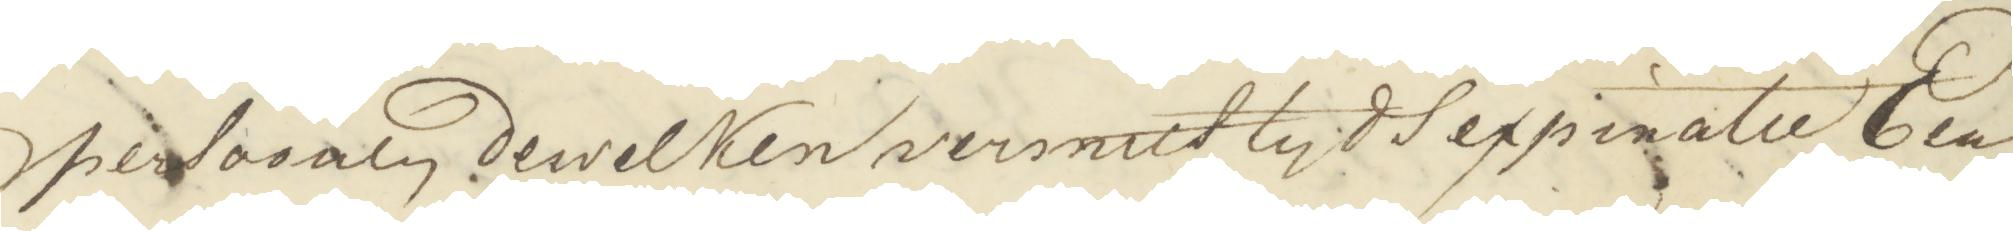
persoonen dewelken vermits tyds expiratie Eer
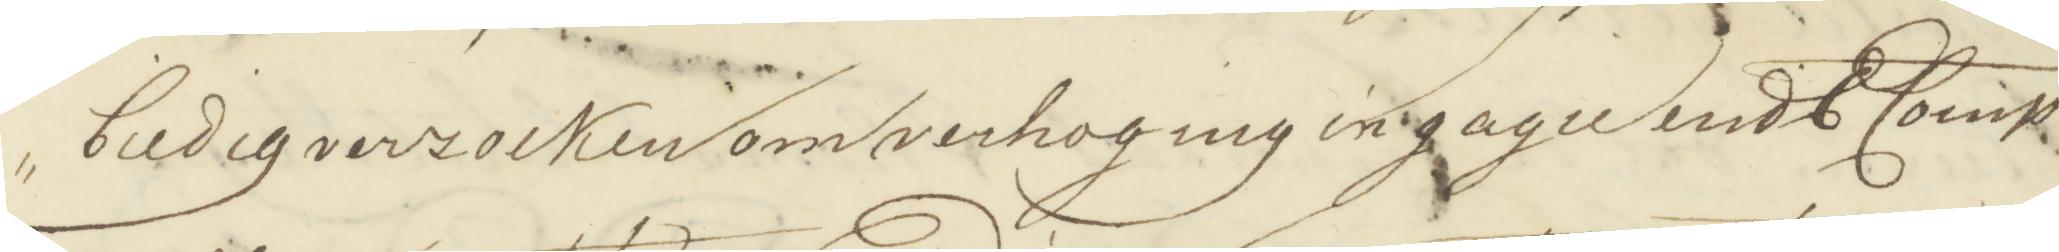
„biedig verzoeken om verhoging in gagie en d'EComp
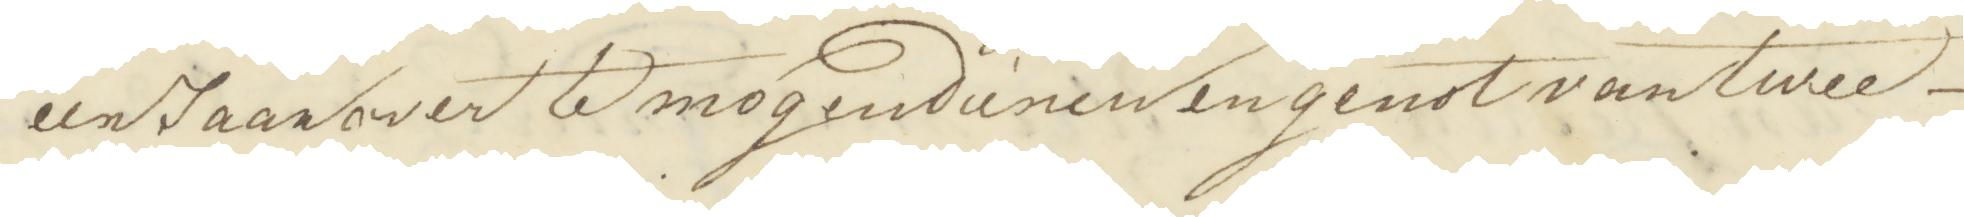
een Jaar over te mogendienen en genot van twee
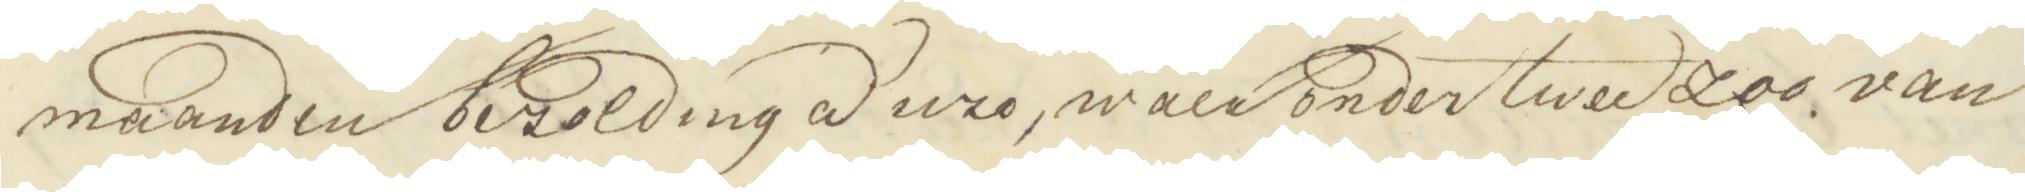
maanden bezolding a uzo, waer onder twee zoo van
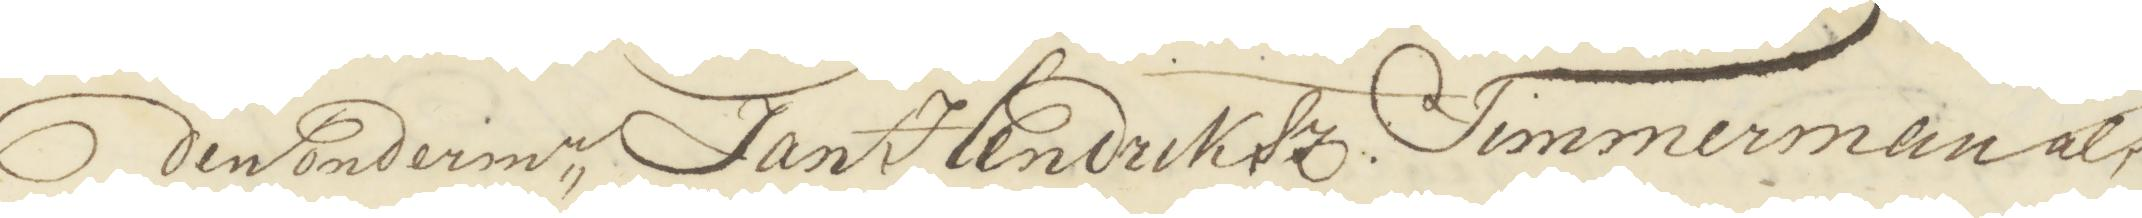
den onderm„r Jan Hendriksz. Timmerman als
